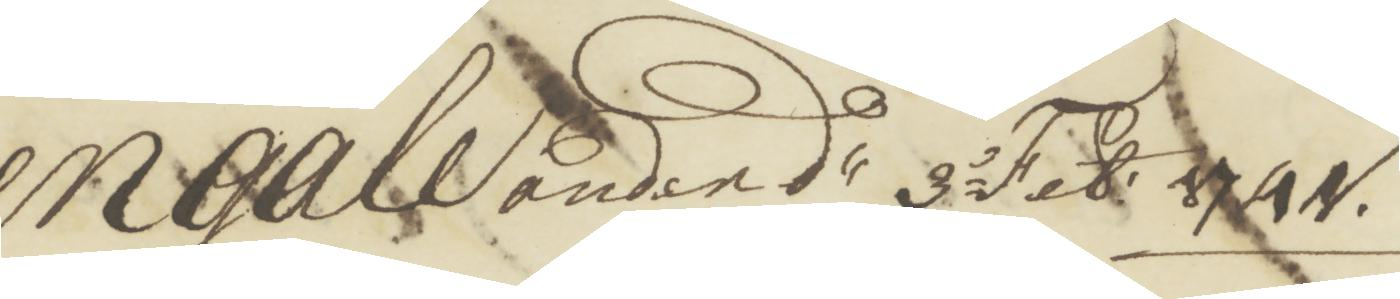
Van Bengale onder d„o 3„' Feb: 1741.
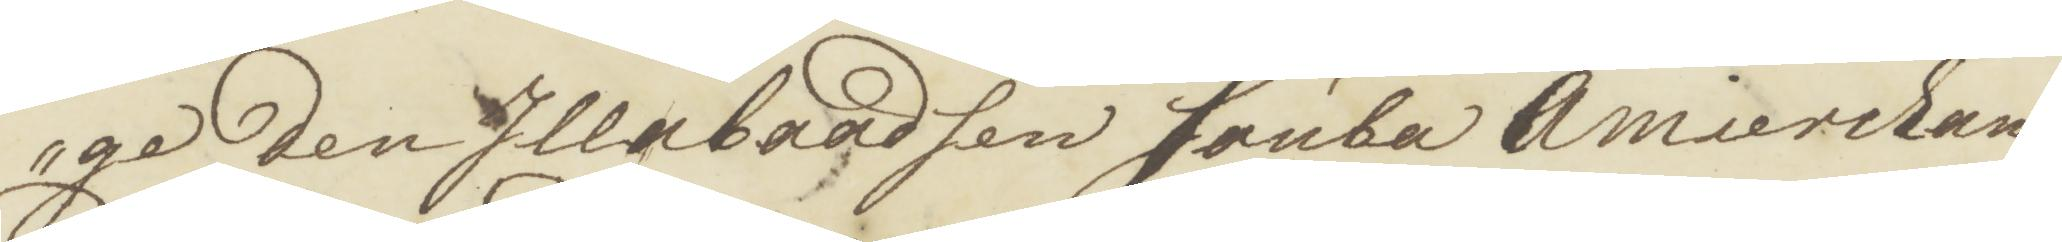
„ge den Jllabaadsen souba Amierchan,
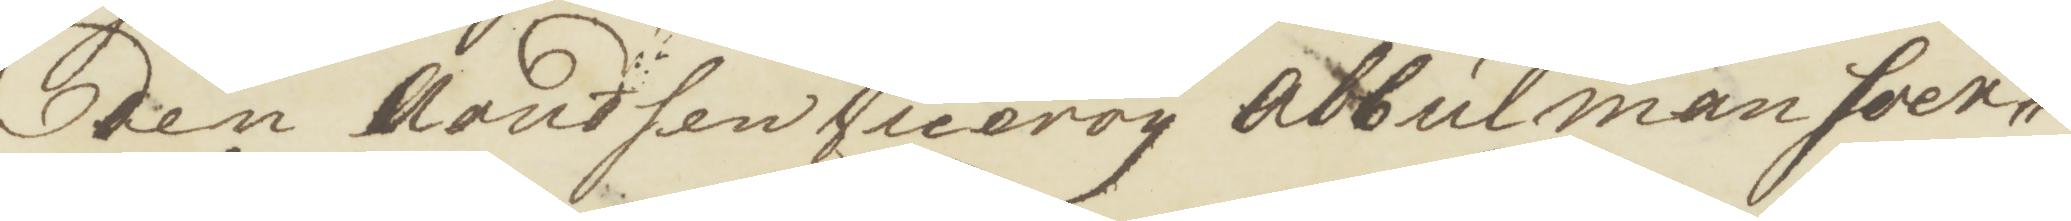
den Aondsen viceroy Abbulman soer„
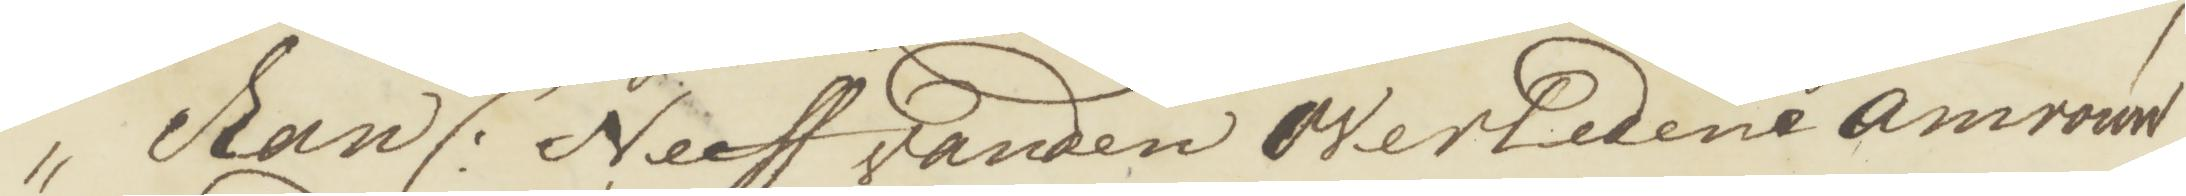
„chan (: Neeff vanden overledene amrouw
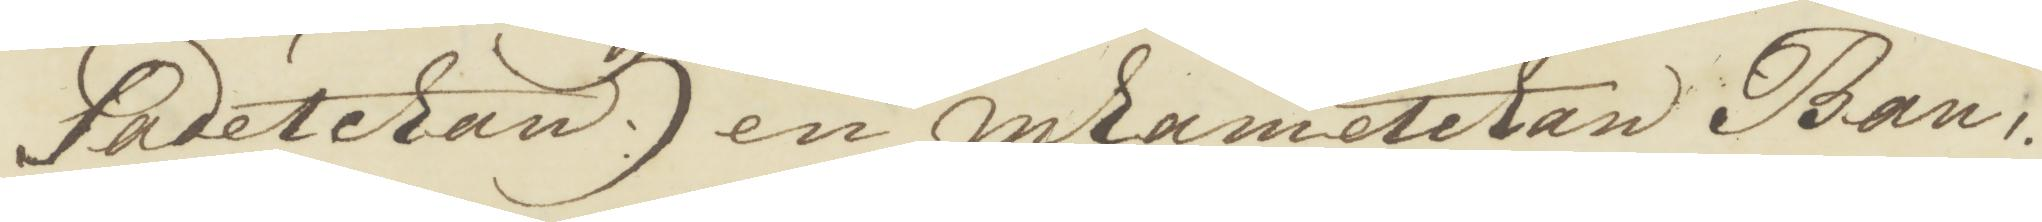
sadetchan:) en mhametchan Ban„
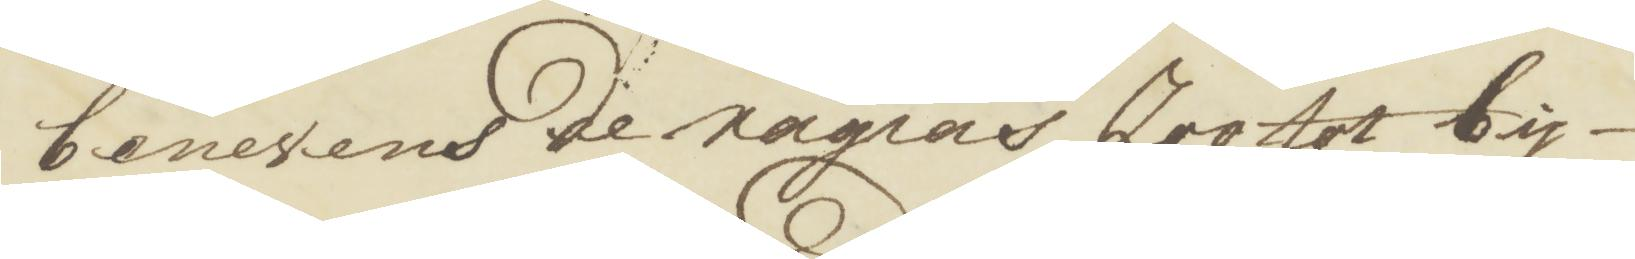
gisch, benevens de ragias zoo tot bij
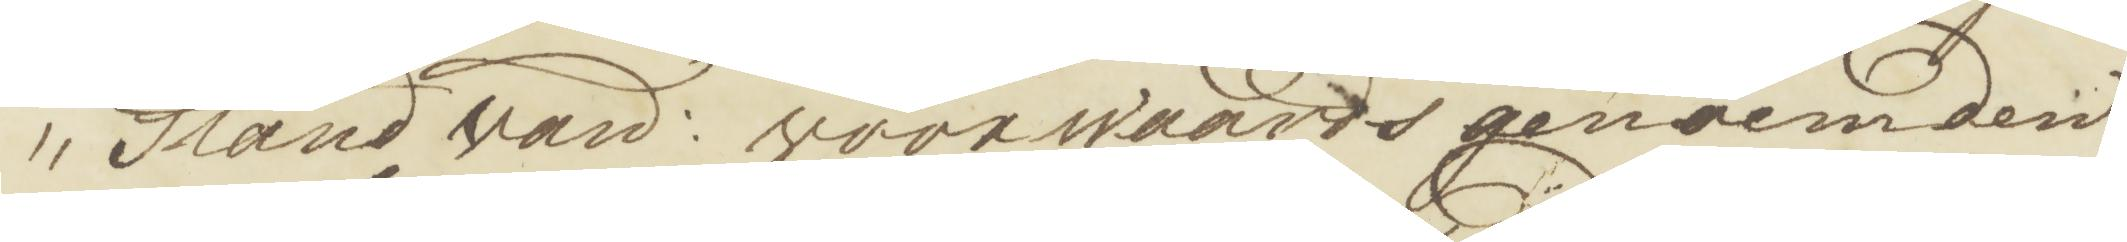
„stand vand: voorwaards genoemden
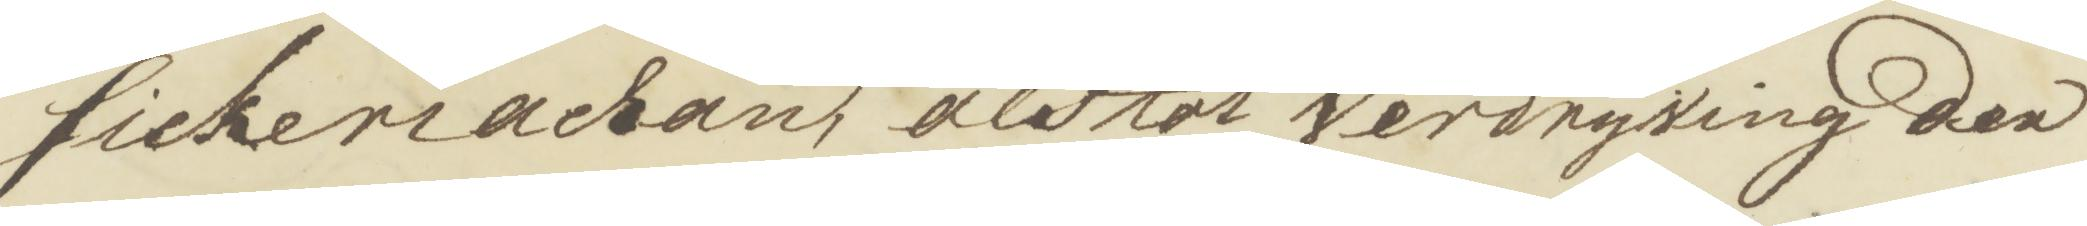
sickeriachan, als tot verdrijving der
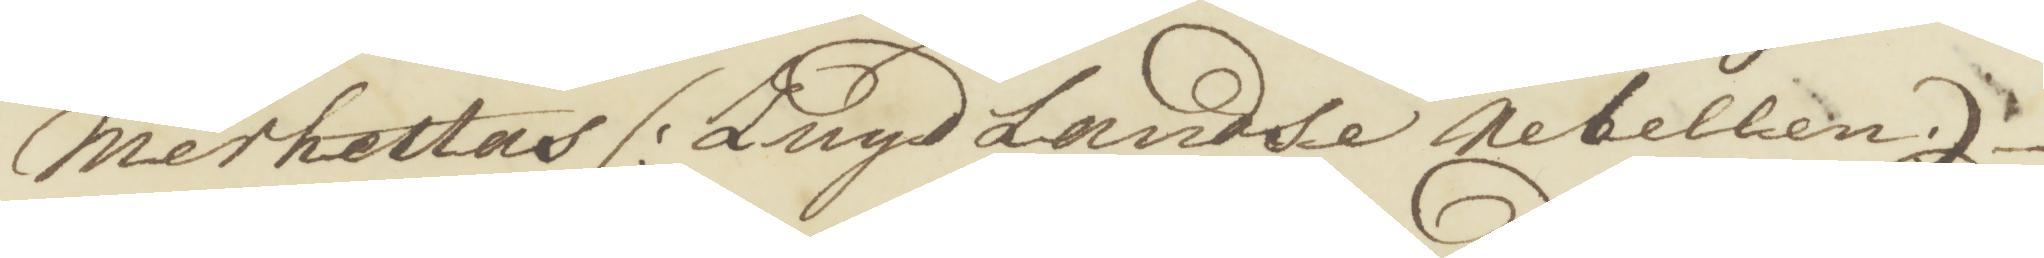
merhettas /:Zuyd Landse rebellen:)
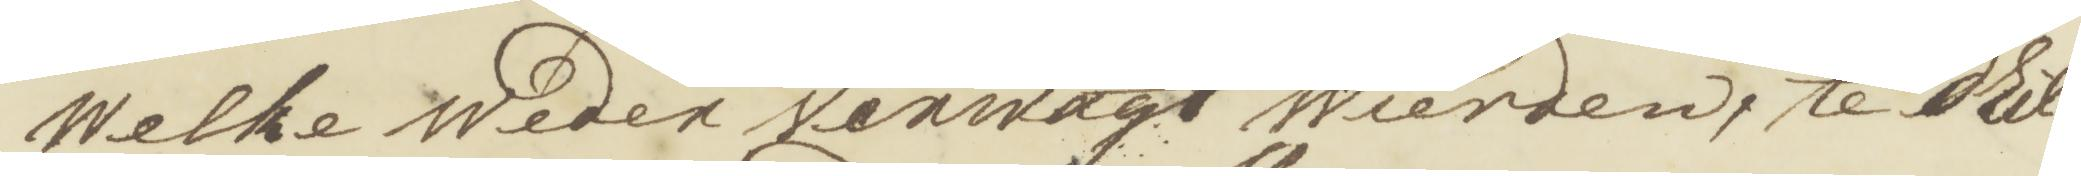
welke weder verwagt wierden, te dhil
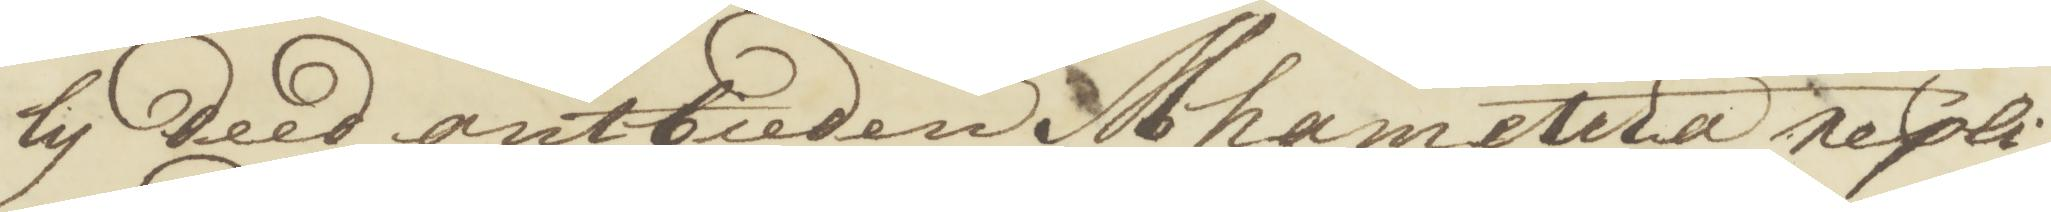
lij deed ontbieden Mhametcha repli„
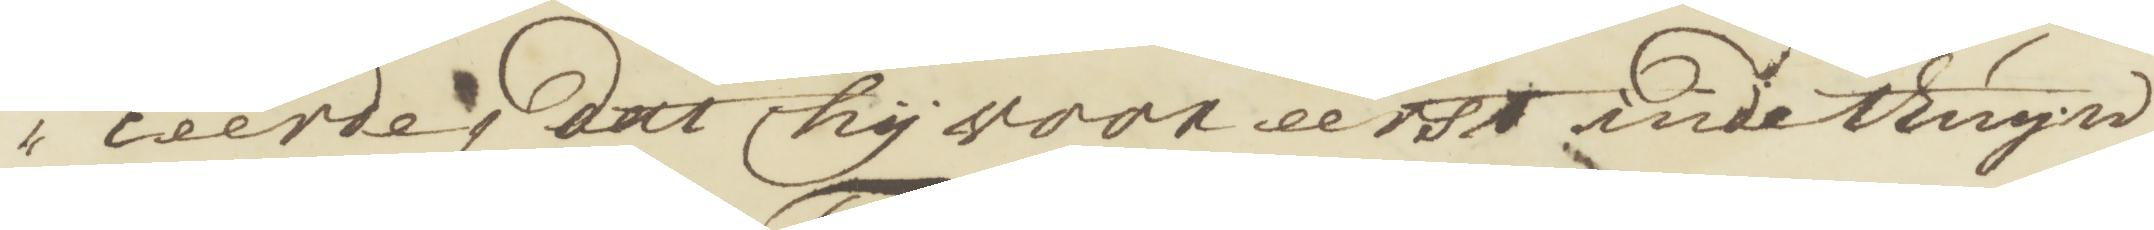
„ceerde, dat hij voor eerst inde thuyn
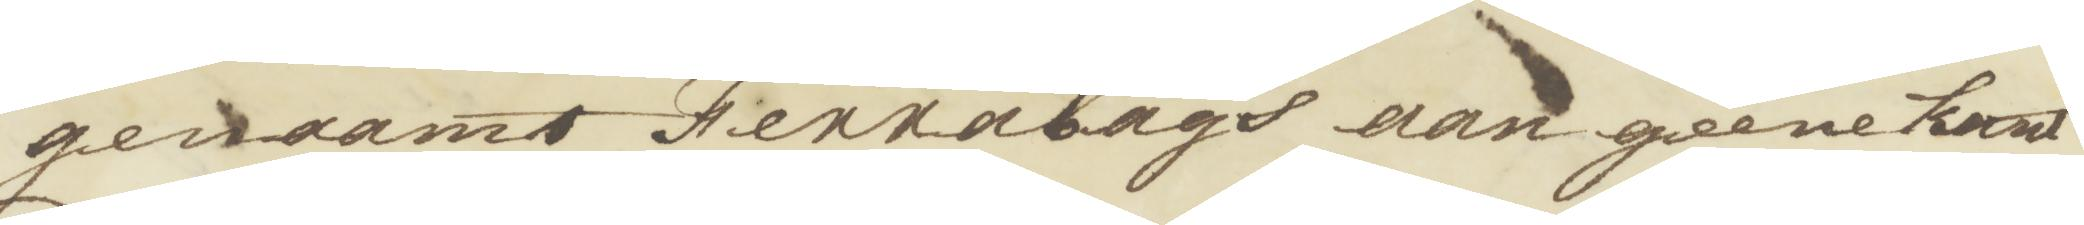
genaamt Ferrabags aan geene kant
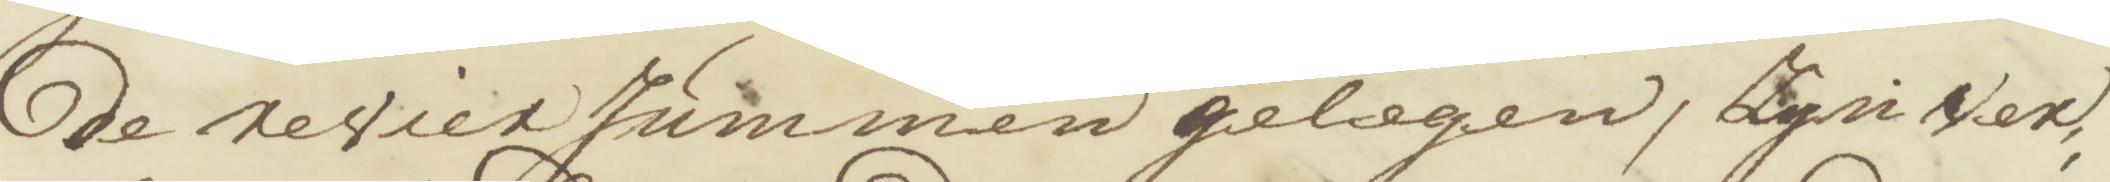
de revier Jummen gelegen, zyn ver„
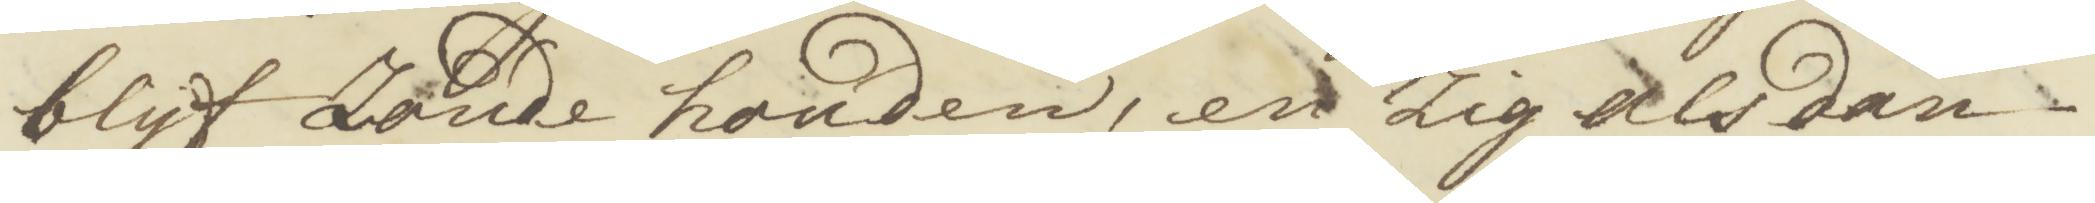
blijf zoude houden, en zig als dan
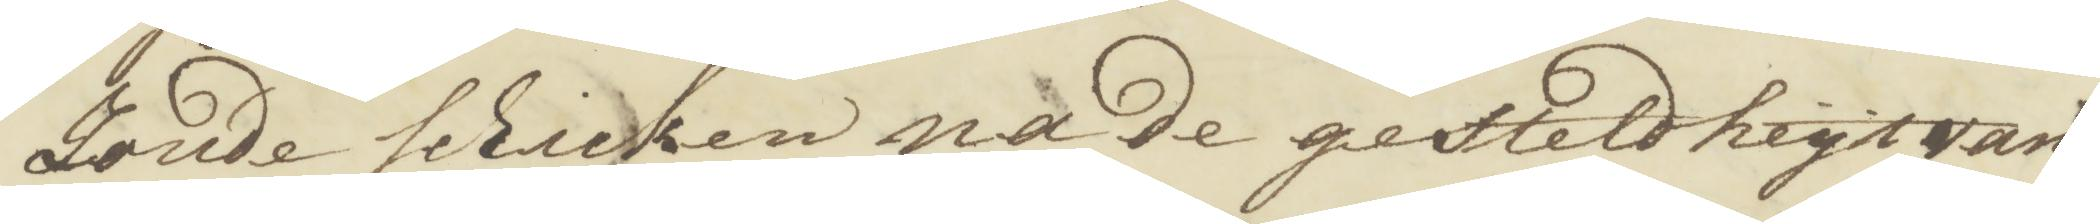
zoude schicken na de gesteldheijt van
